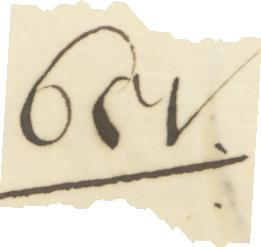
651.
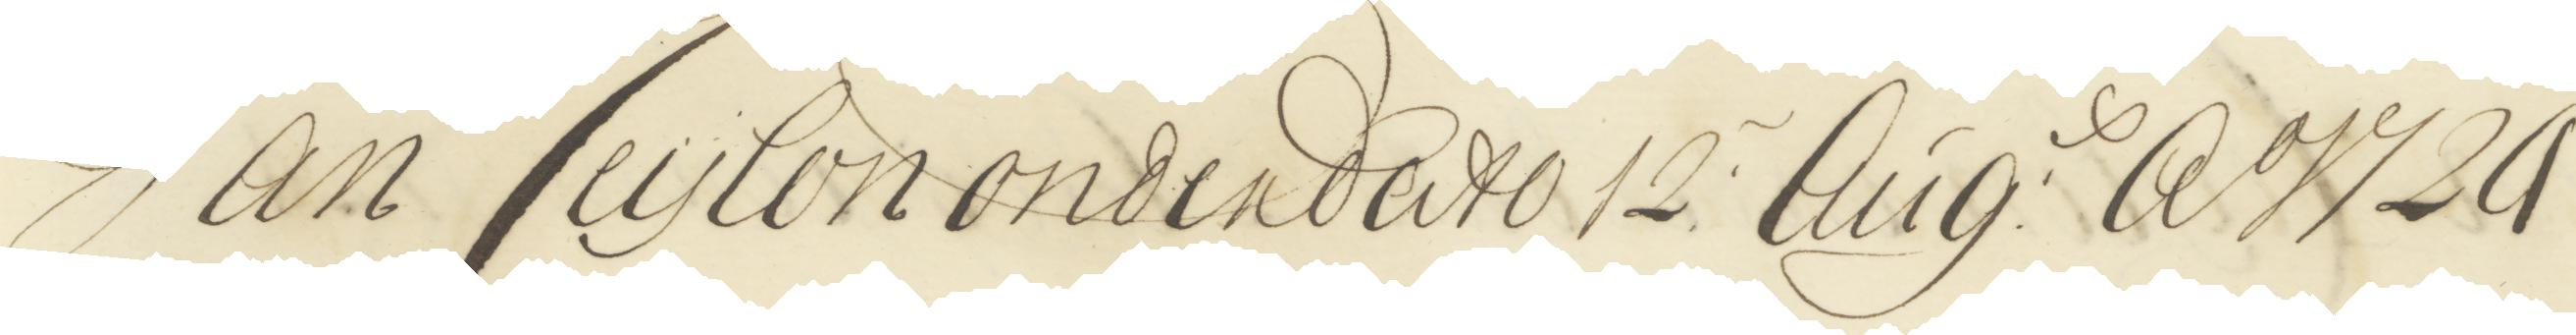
Van Ceijlon onder dato 12:~ Aug:s A„o 1724
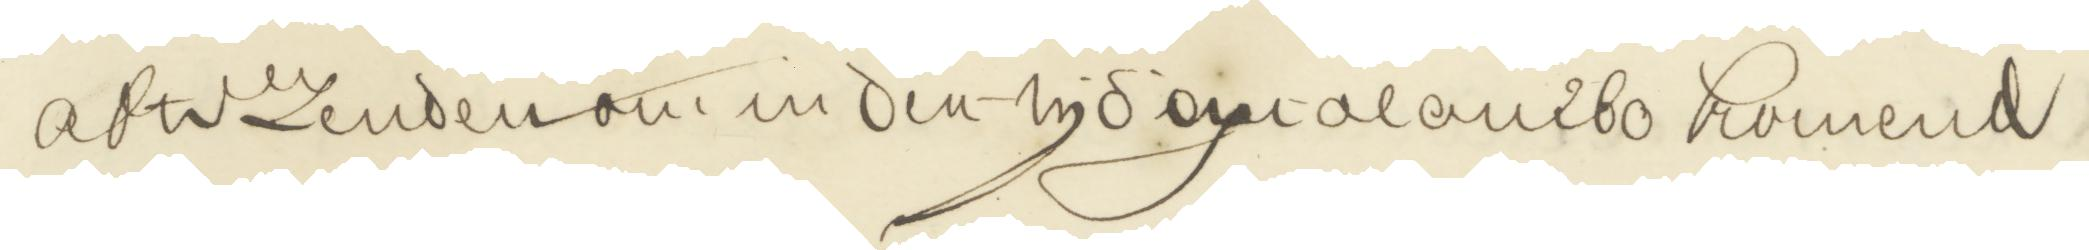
aftezenden om in der tijd op colombo komende
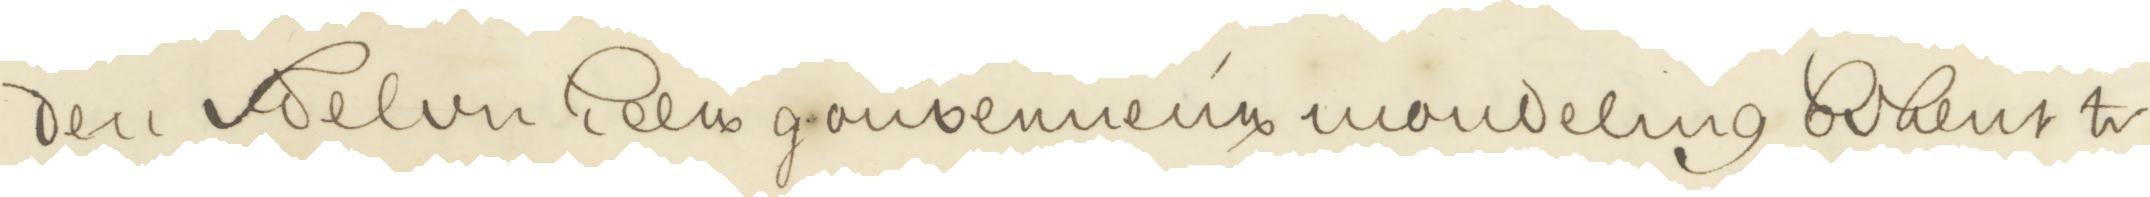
den Edelen heer gouverneur mondeling bekent te
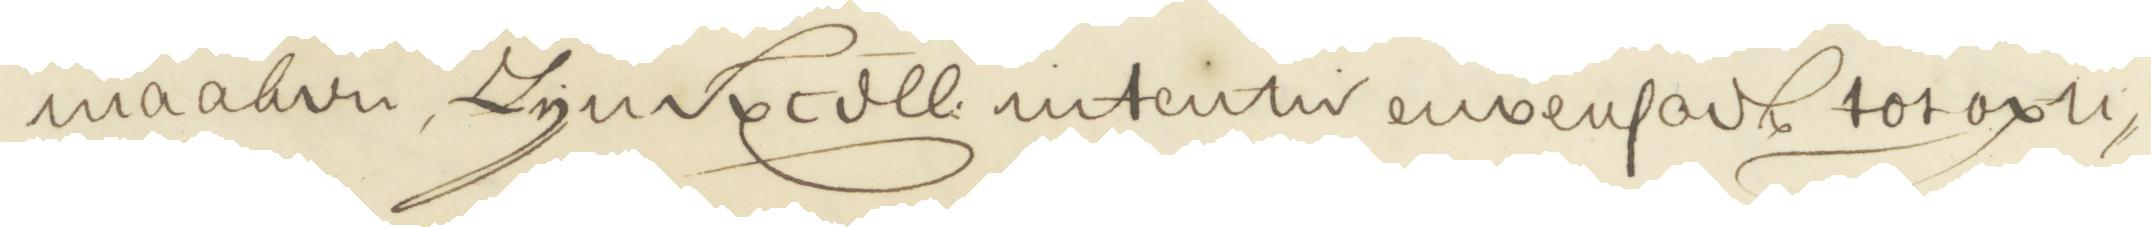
maaken, zijn Excell: intentie enversoek tot opti„
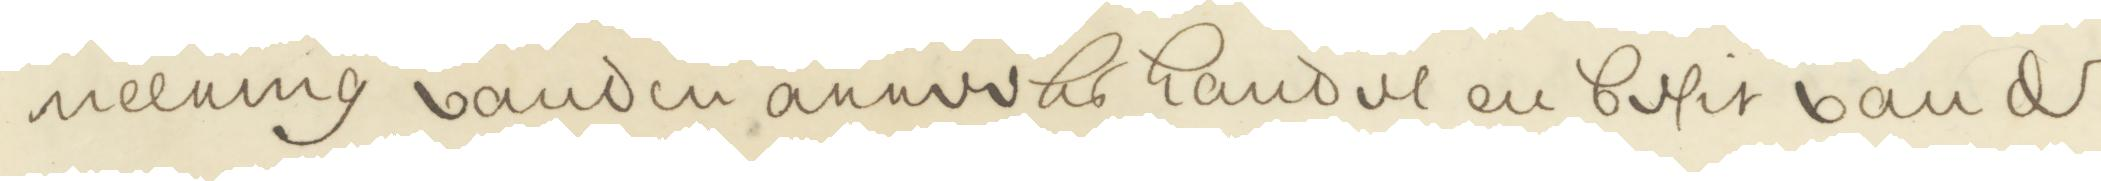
neering van den arreeks handel en besit van de
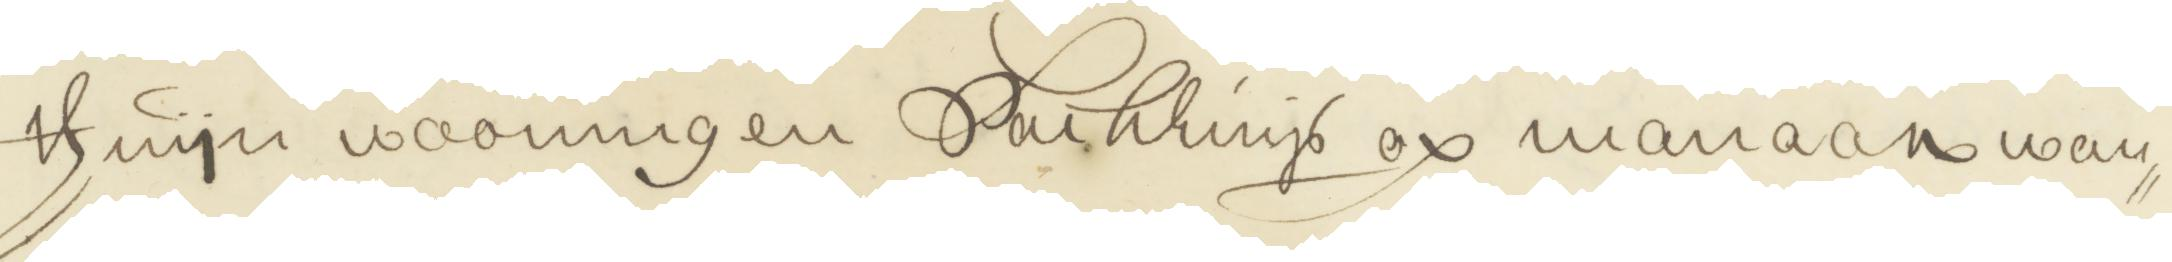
thuijn wooning en Packhuijs op manaar wan„
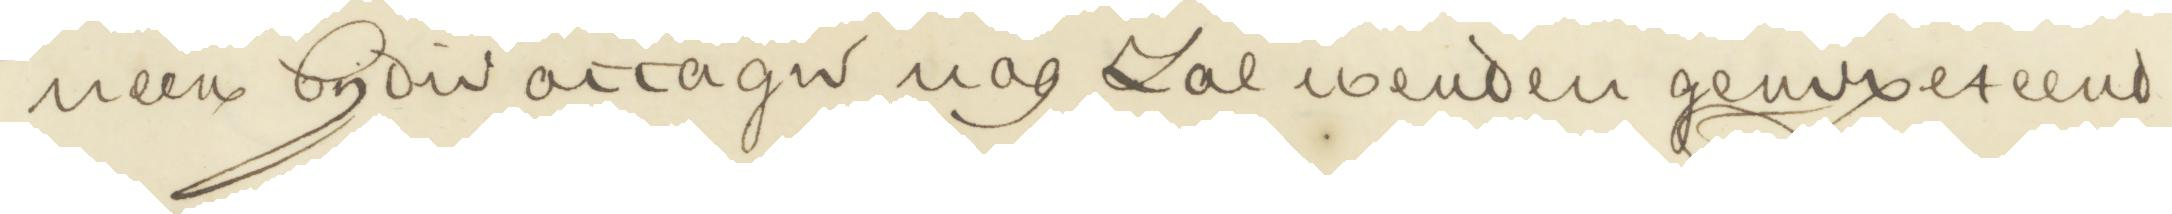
neer bij die occagie nog zal werden gerepeteerd
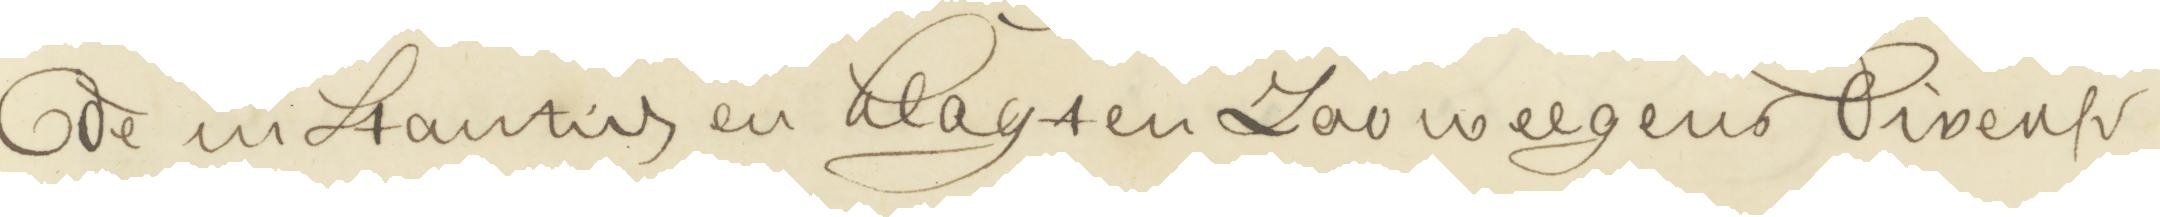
de instantien en klagten zoo weegens diverse
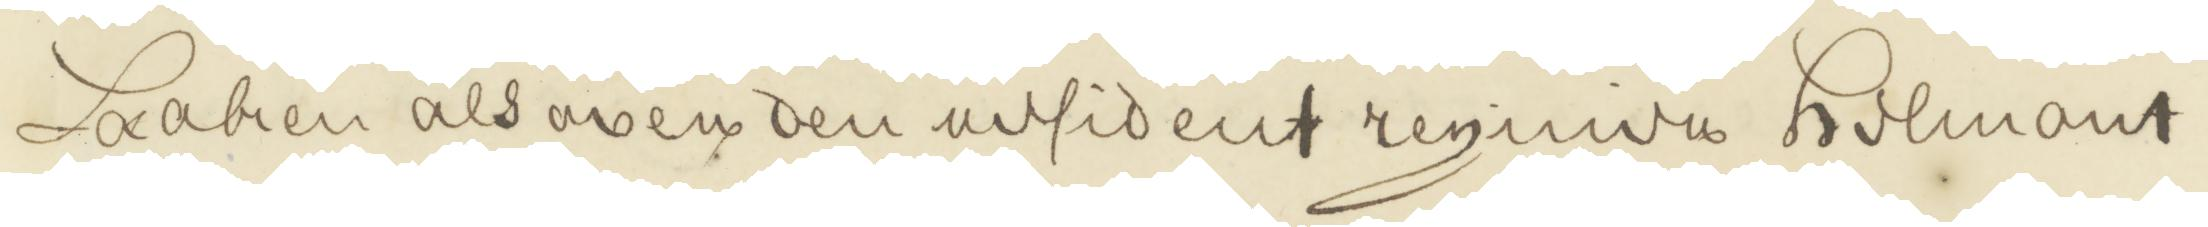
zaken als over den resident reijmer Helmant
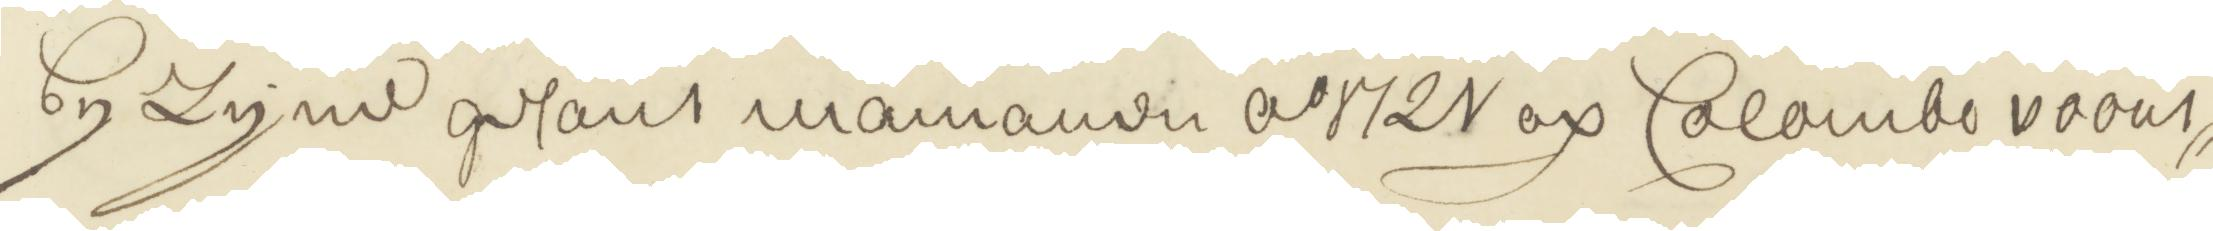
by zijne gesant mamanen ao 1721 op Colombo voort„
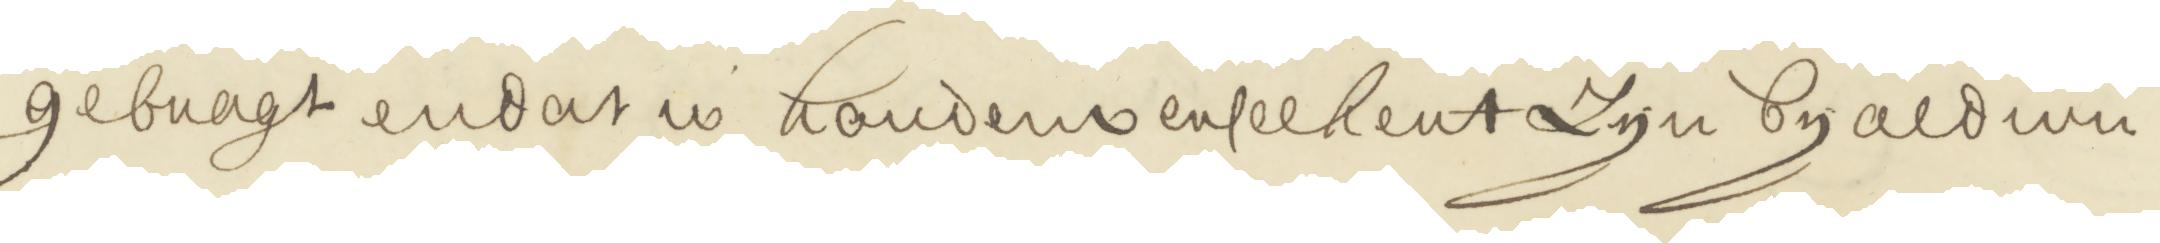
gebragt en dat w' konden erseekert zijn bij aldien
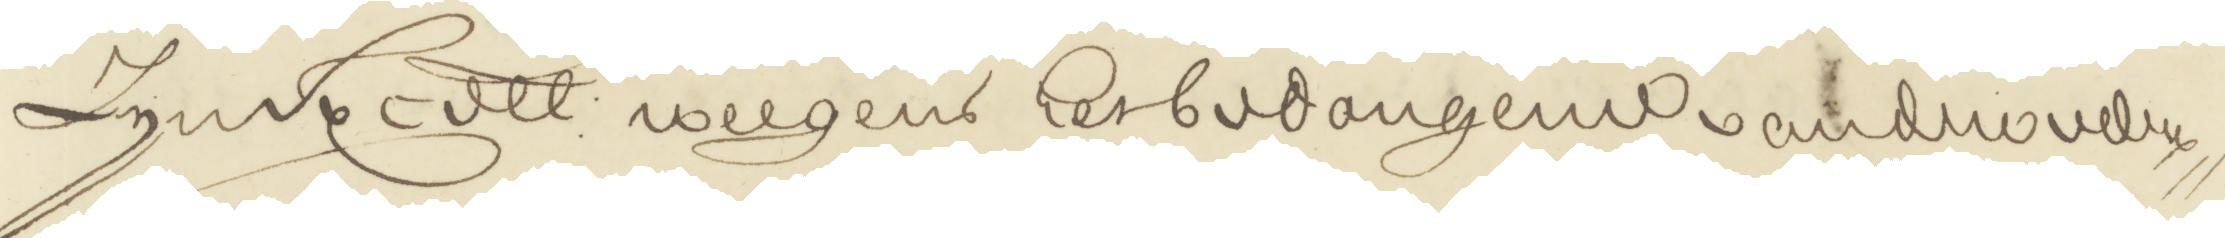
zijn Excell: weegens het bedongene van de weder„
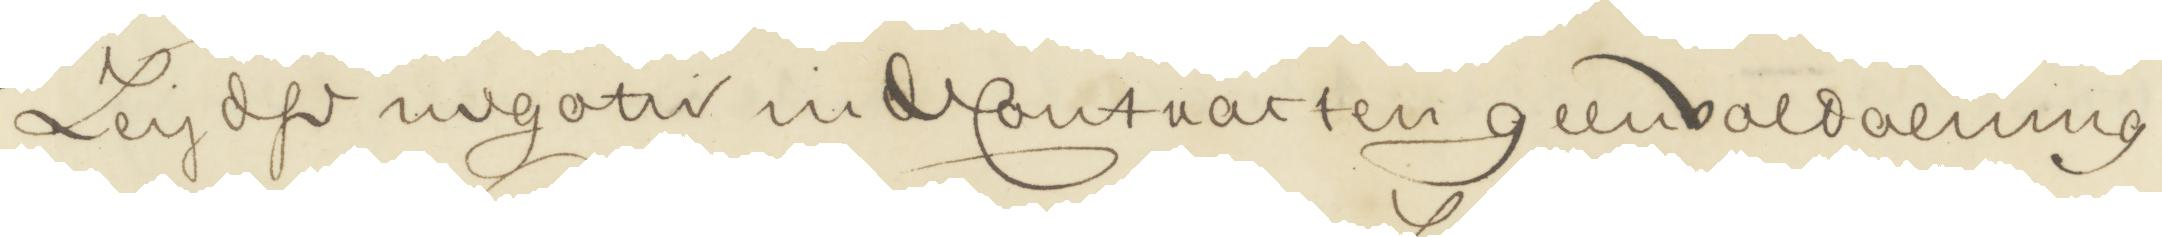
zeijdse negotie in de Contracten geen voldoening
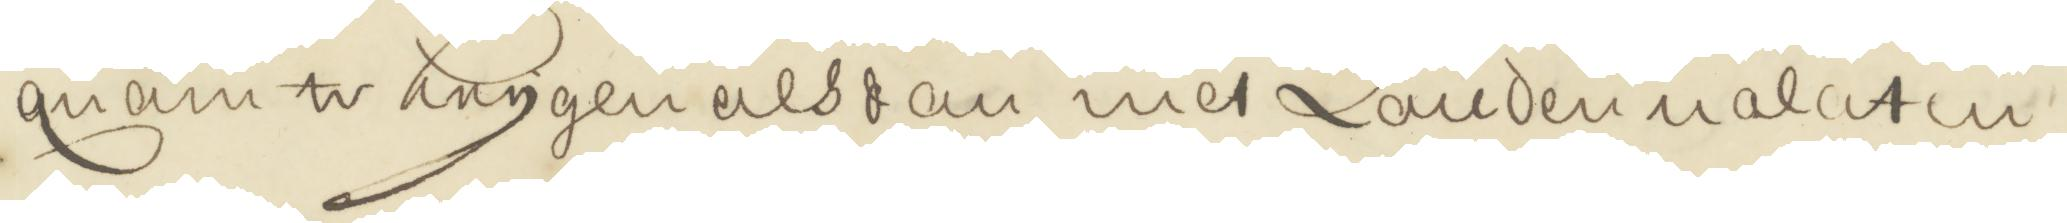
quam te krijgen als dan niet souden nalaten
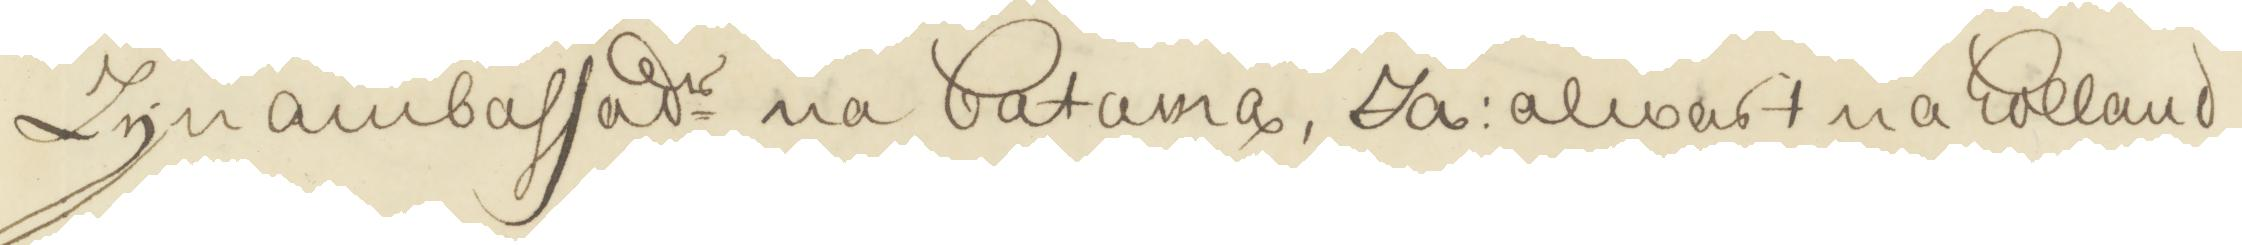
zijn ambassad=s na batavia, Ia: alwas 't na holland
